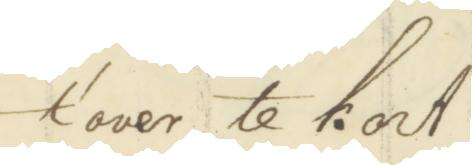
t'over te kort
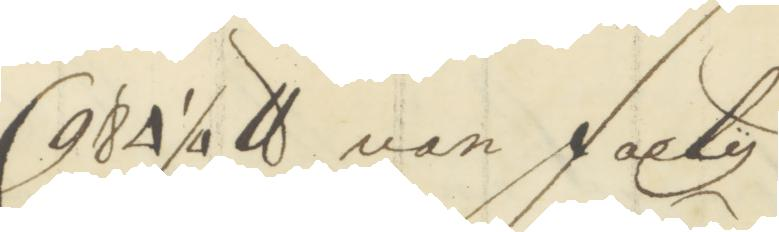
984¼ lb van foelij
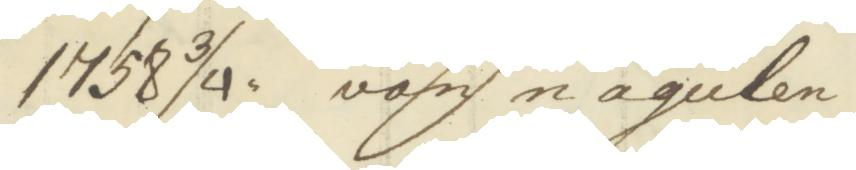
1758 ¾ „ van nagulen
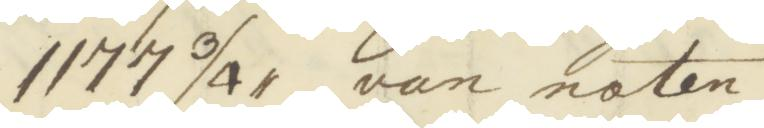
1177 ¾ „ van noten
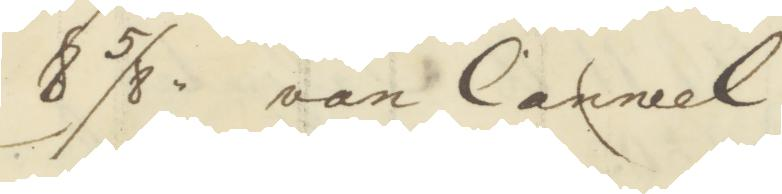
8 5/8 „ van Canneel
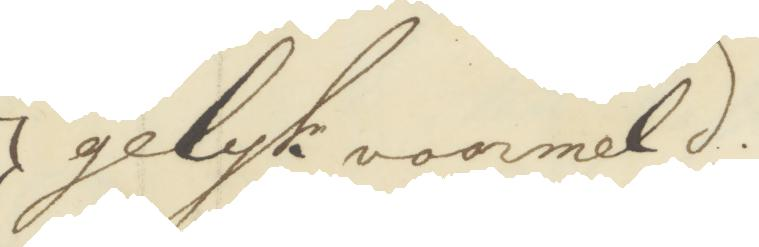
gelyk voormeld.
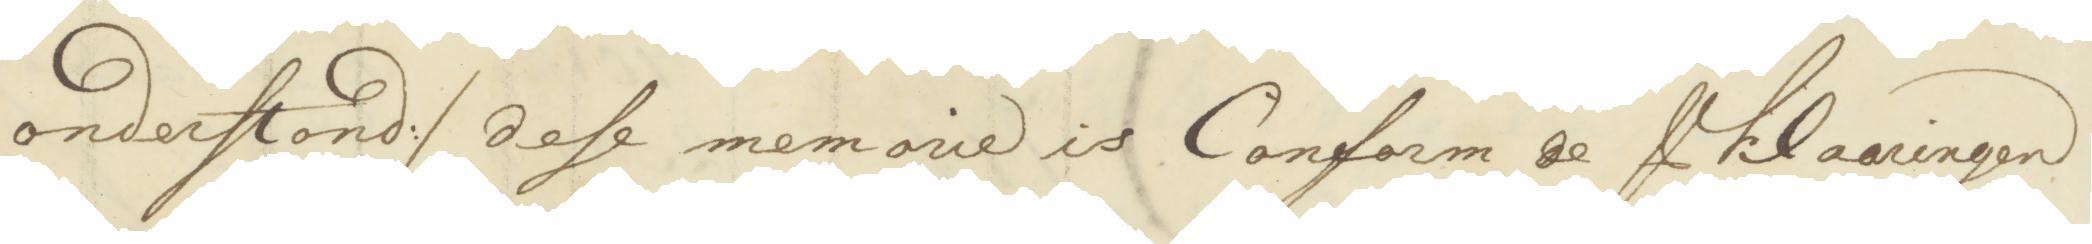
onderstond:/ dese memorie is Conform de verklaaringen
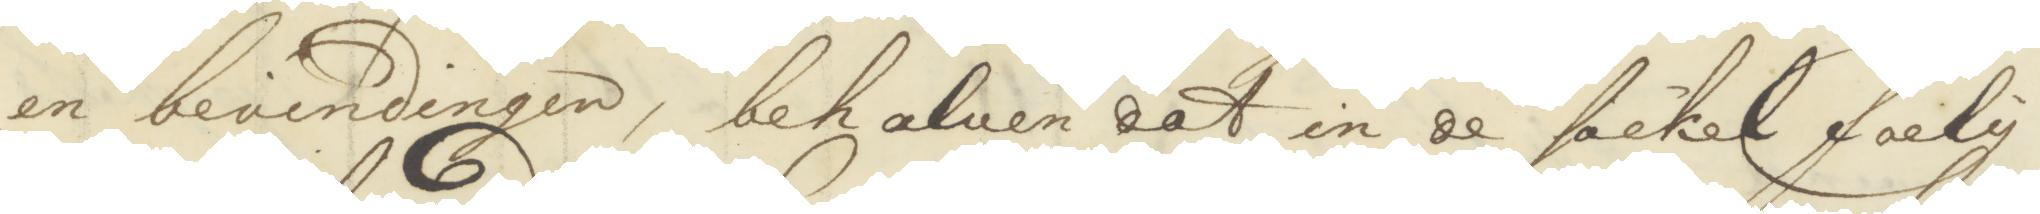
en bevindingen, behalven dat in de sockel foelij
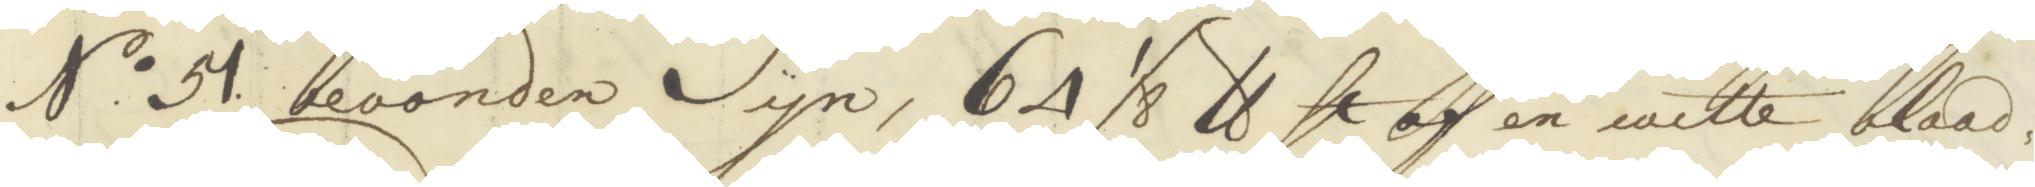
N.o 51. bevonden sijn, 64 1/8 lb st of en witte blaad
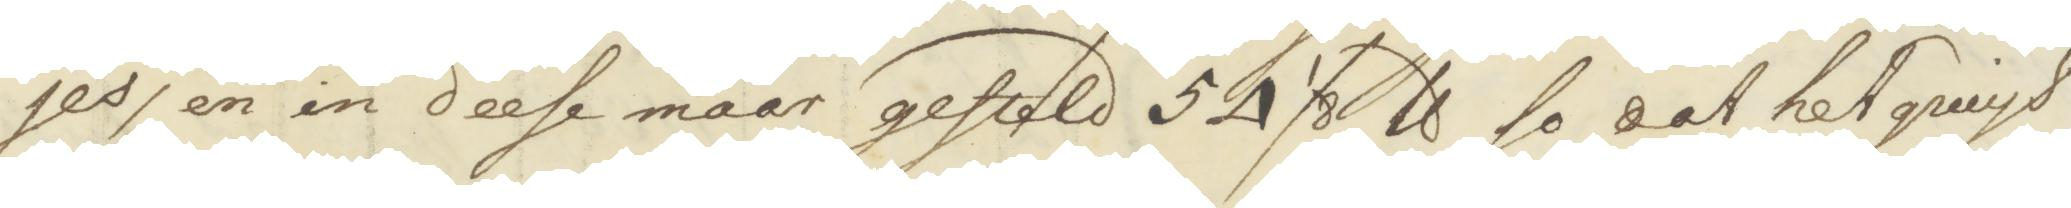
jes, en in deese maar gesteld 54 1/8 lb so dat het gruijs
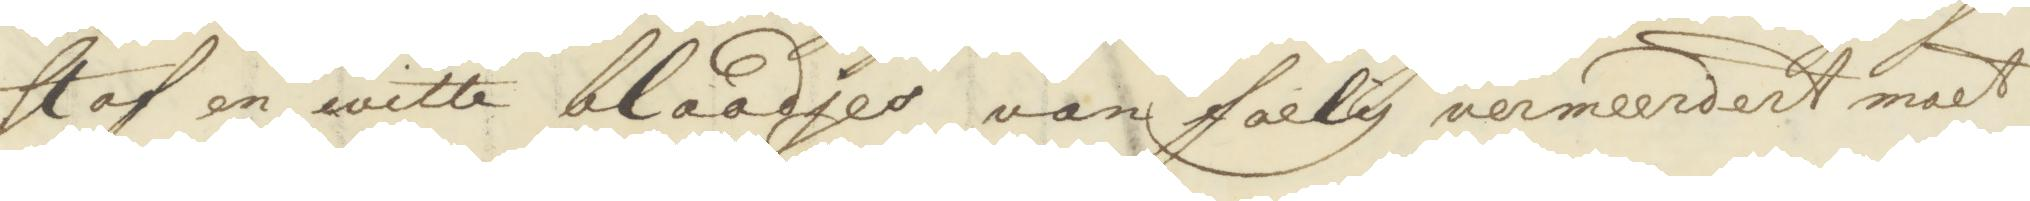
stof en witte blaadjes van foelij vermeerdert moet
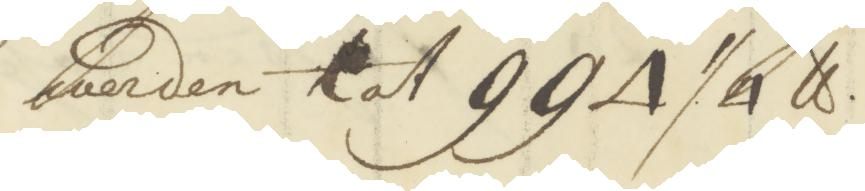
werden tot 994¼ lb
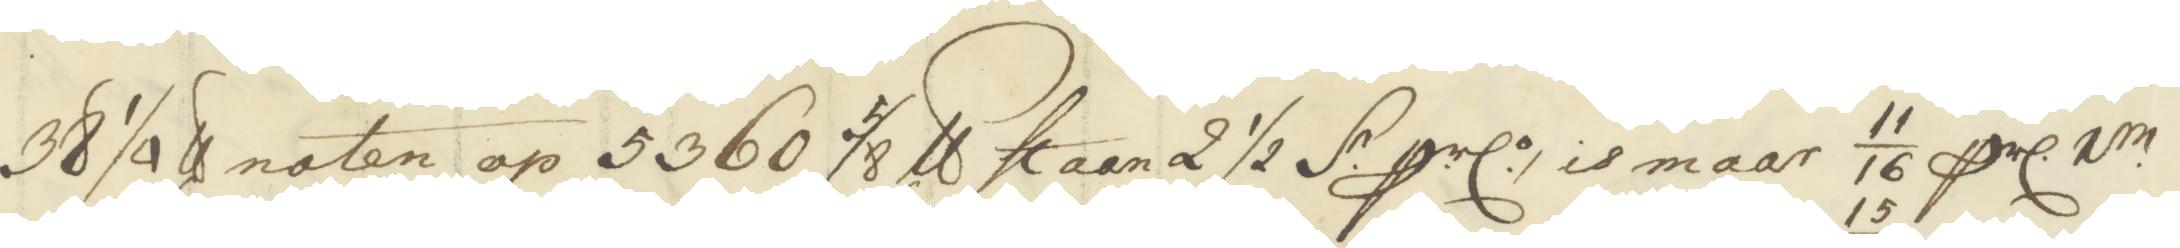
38¼ lb noten op 5360 5/8 lb staan 2½ s.r p.rC.o, is maar 11/16 prC. r.m
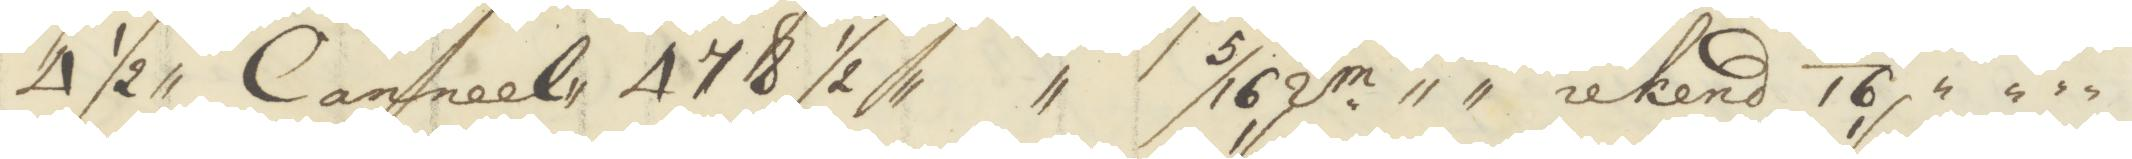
4½ „ Canneel „ 478 ½ „ „ 5/16 r.m „ „ rekend 15/16 „ „ „ „
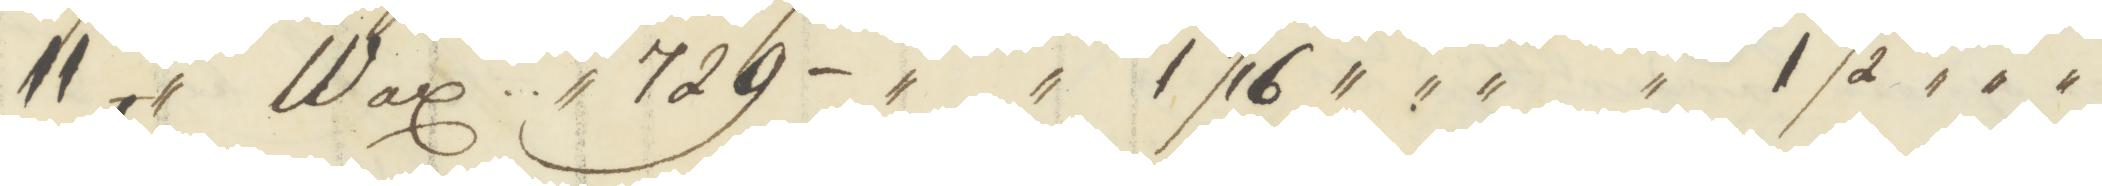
11 — „ Wax . . „ 729 — „ „ 1 1/16 „ „ „ „ 1½ „ „ „
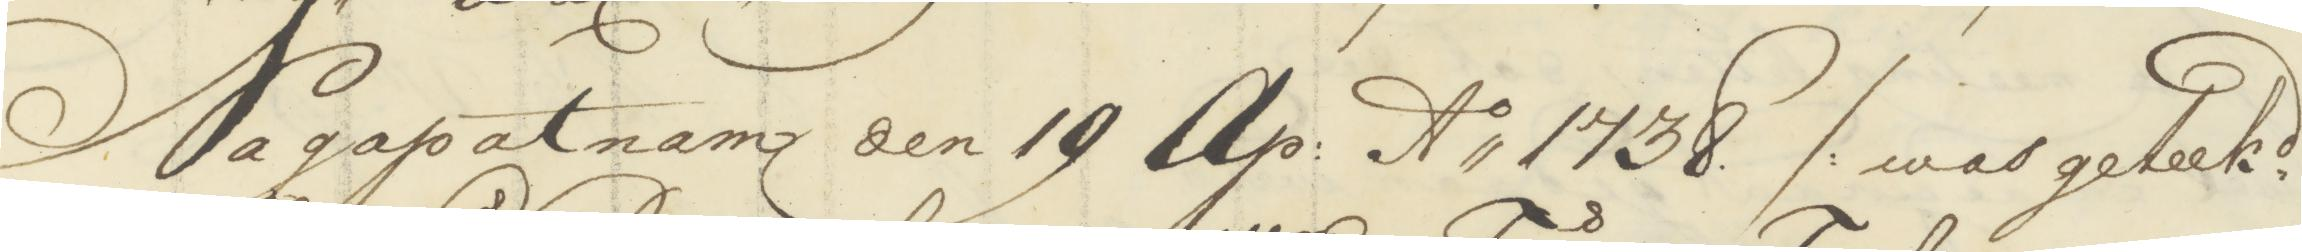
Nagapatnam den 19 Ap: A„o 1738. /:was geteek„d
